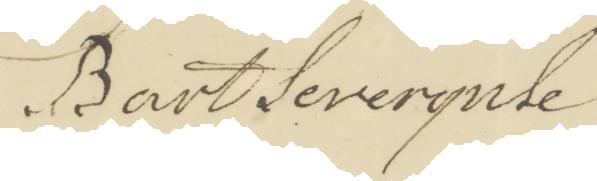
Bart Severynse
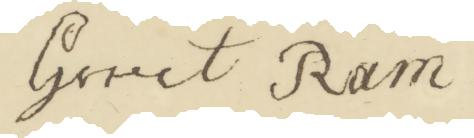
Gerrit Ram
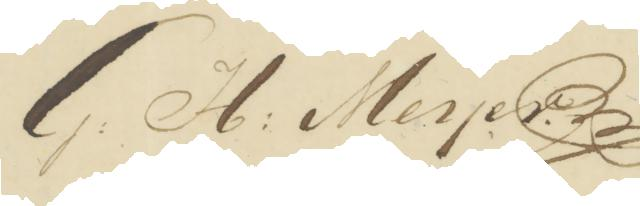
G: H: Meyer.
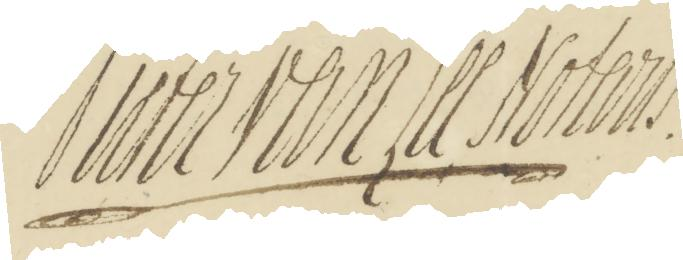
Pieter van Lée Notaris
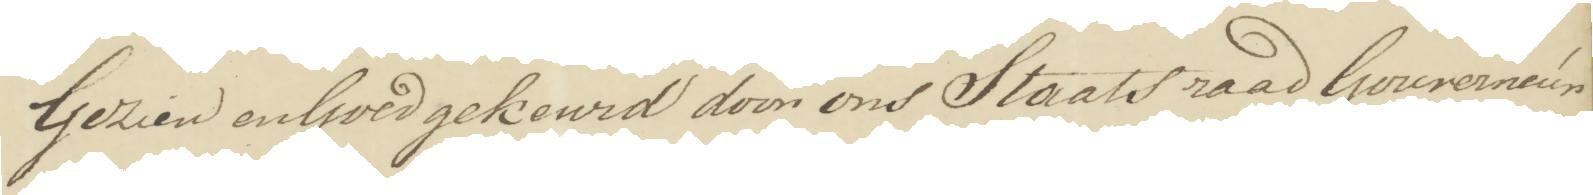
Gezien en Goedgekeurd door ons Staatsraad Gouverneur
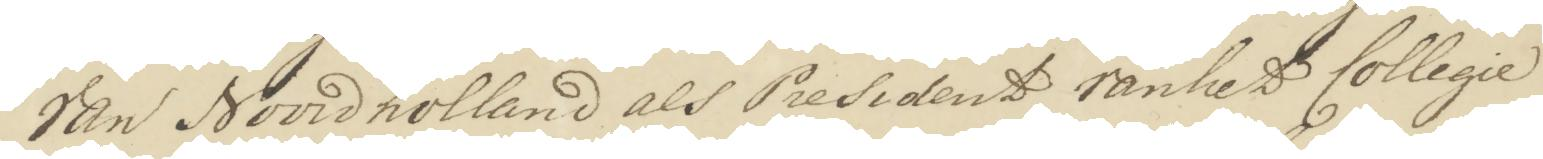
van Noordholland als President vanhet Collegie
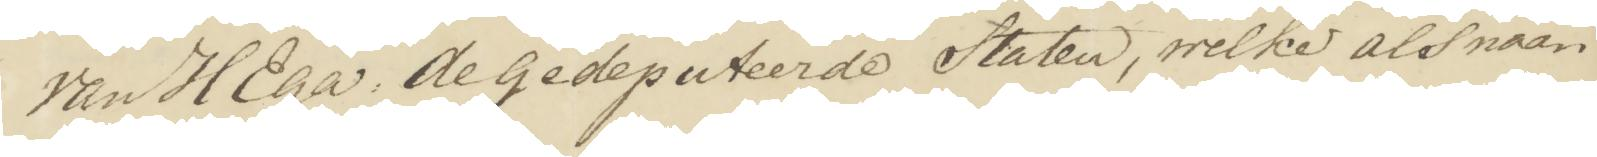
van H Ega: de Gedeputeerde Staten, welke als naar
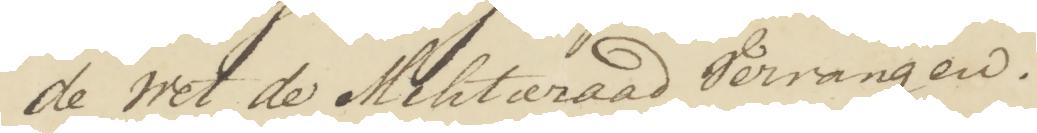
de wet de Militieraad Vervangen.
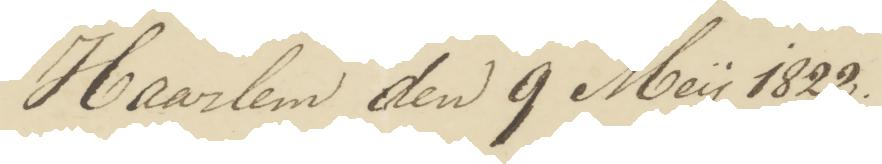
Haarlem den 9 Meij 1822.
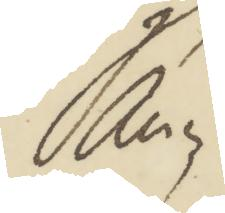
Vany
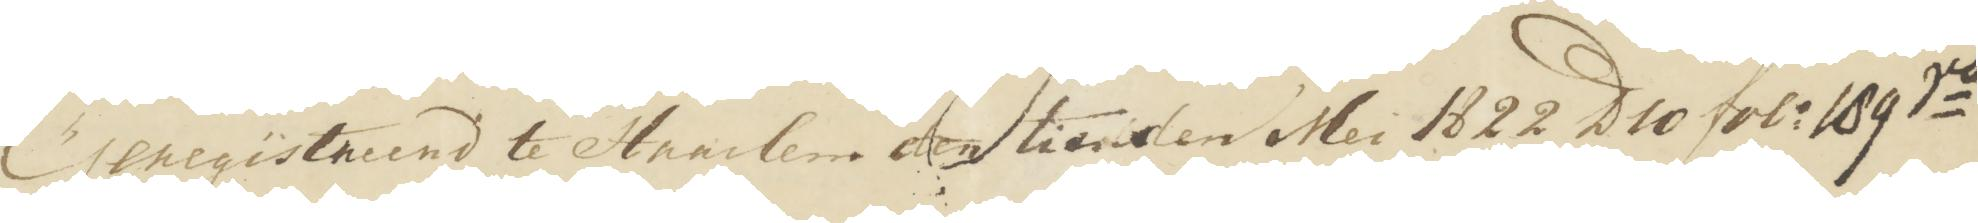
Geregistreerd te Haarlem den tienden Mei 1822 D10 fol: 189 V=o
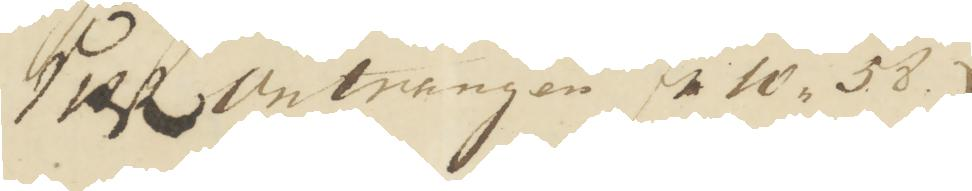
V122 Ontvangen ƒ10„ 58
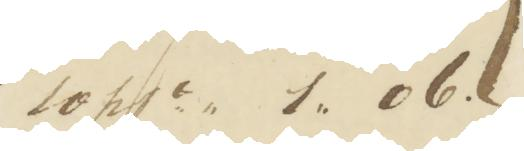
10pc„t 1„ 06.
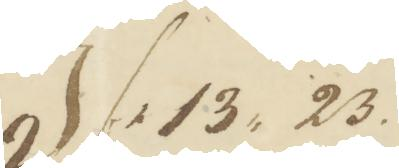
ƒ13„ 23.
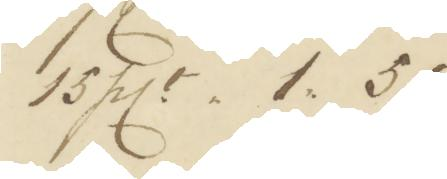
15 pc.t 1„ 52
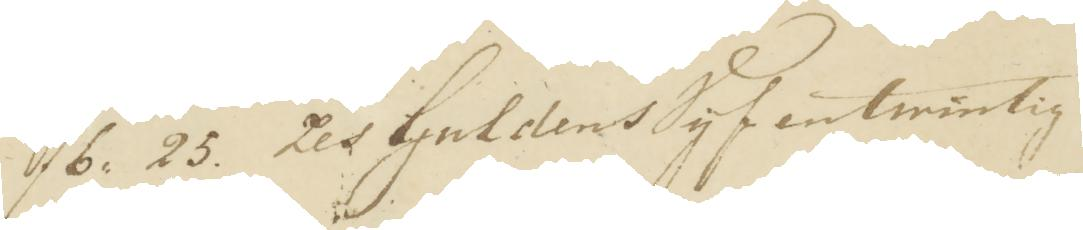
ƒ6„ 25. zes Guldens Vijf en twintig
